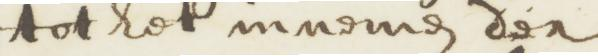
tot het innemen der
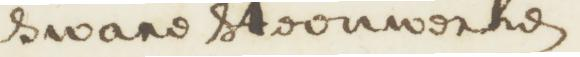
sware steenwerken
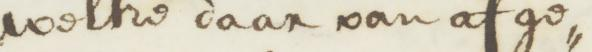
welke daar van afge„
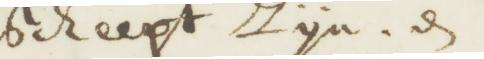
scheept Zijn. en
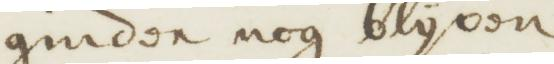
ginder nog blijven
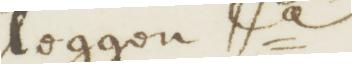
leggen &=a
